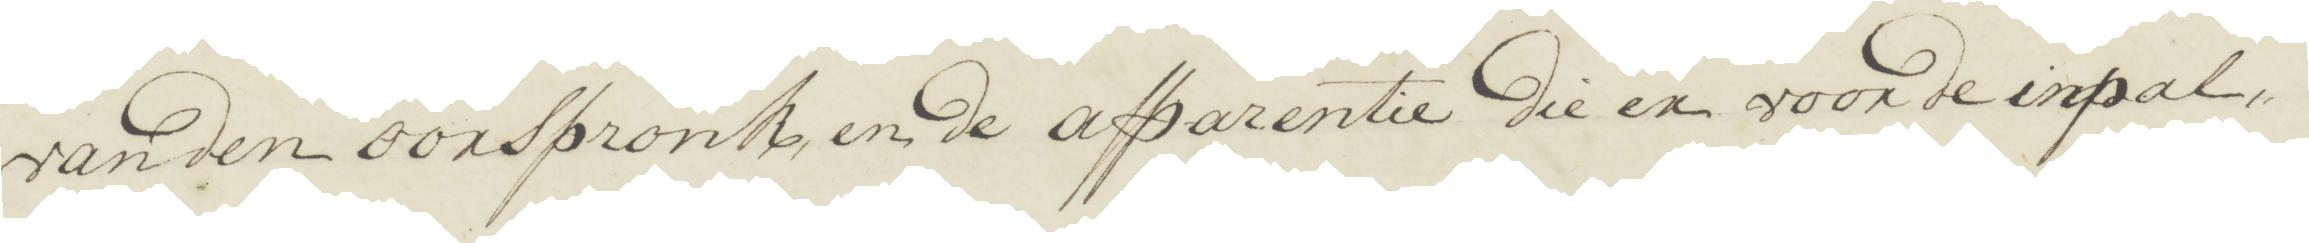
van den oorspronk, en de apparentie die er voor de inpal„
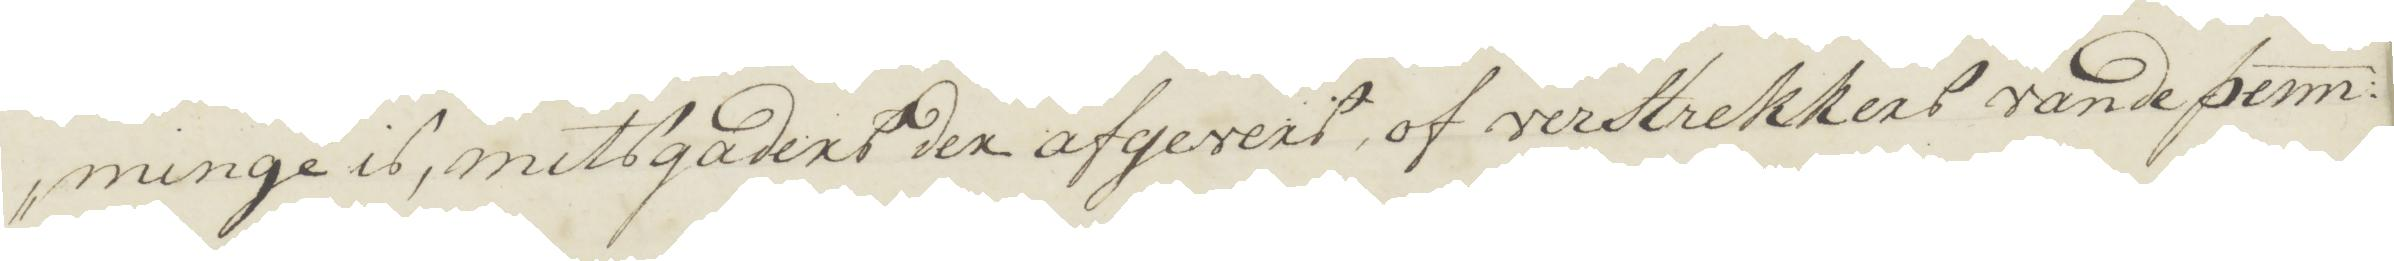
„minge is, mitsgaders der afgevers, of verstrekkers van de penn:
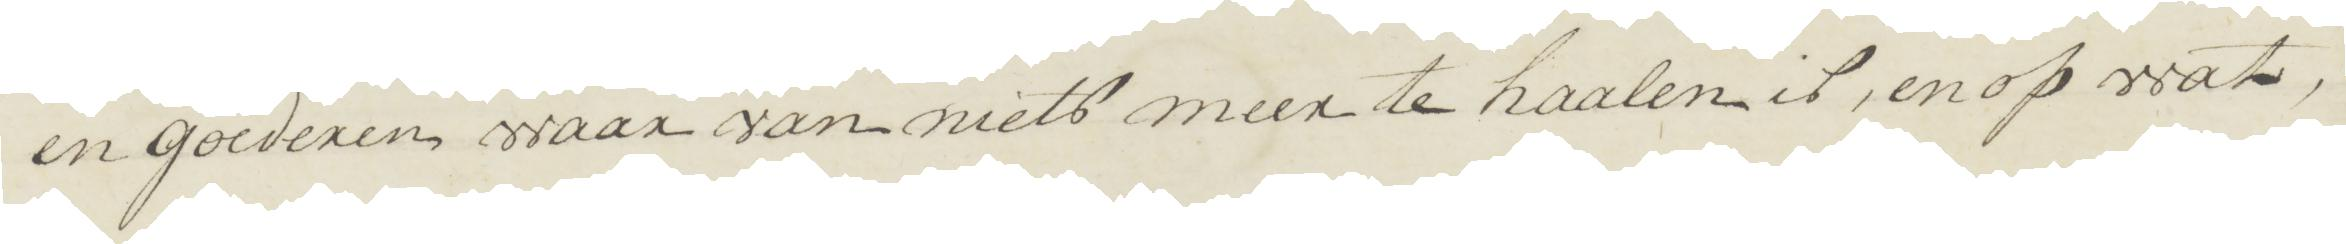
en goederen waar van niets meer te haalen is, en op wat,
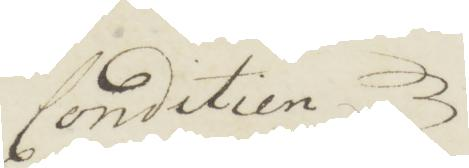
Conditien
